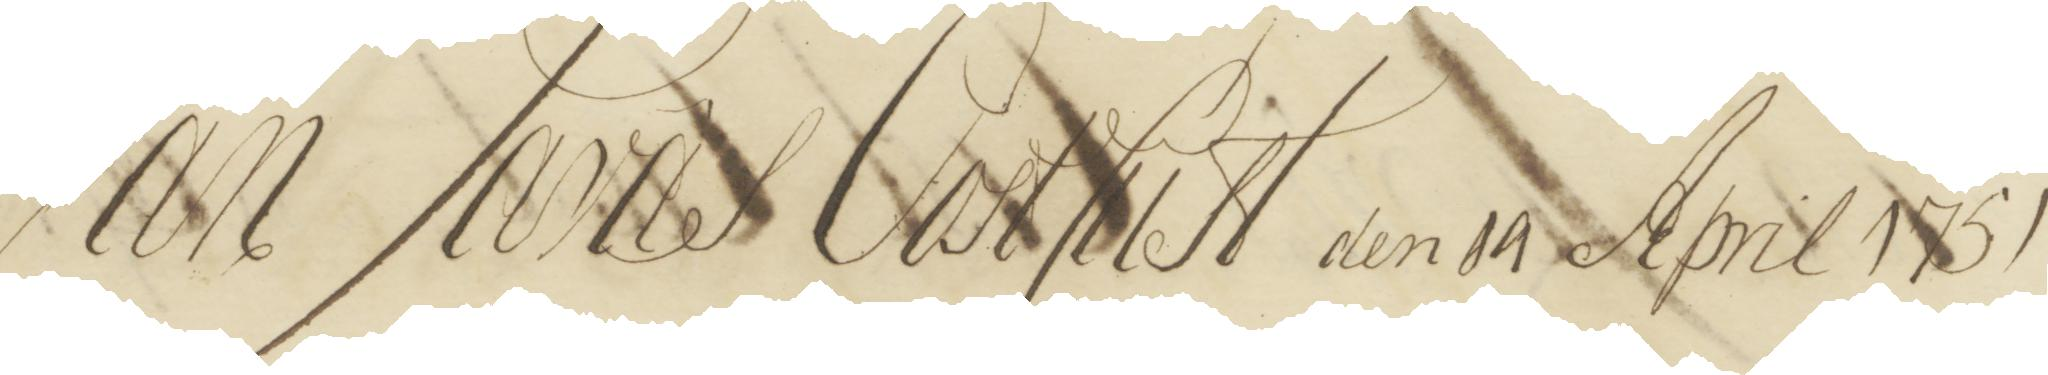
Van Javâs Oost Cust den 14 April 1751
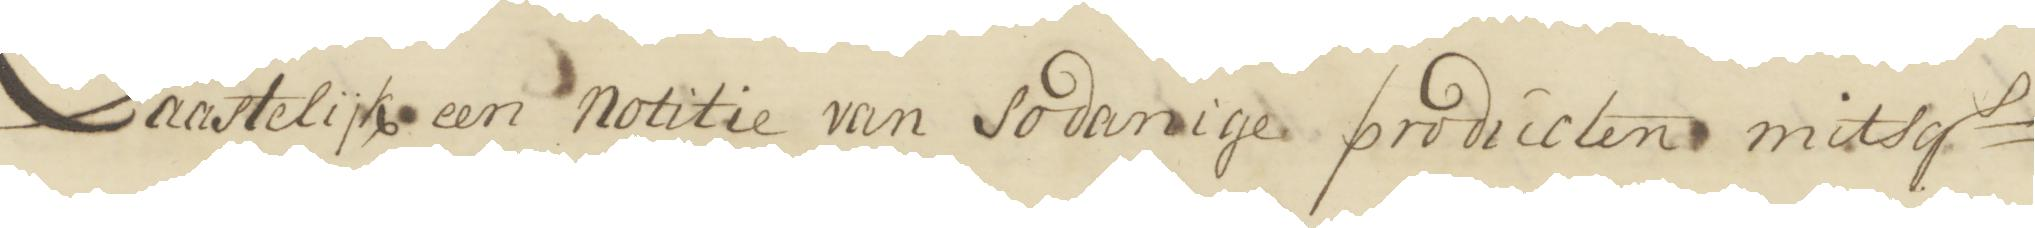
Laastelijk een notitie van sodanige producten mitsg=s
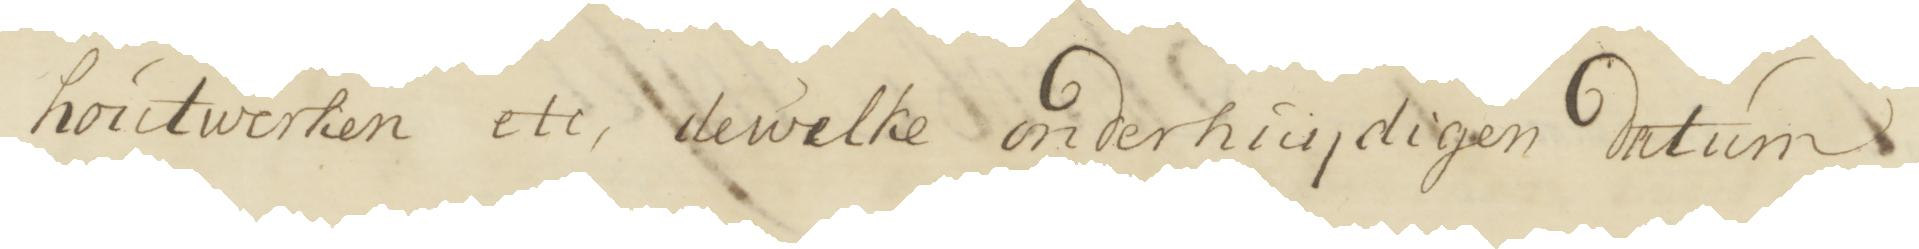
houtwerken etc, dewelke onderhuijdigen datum
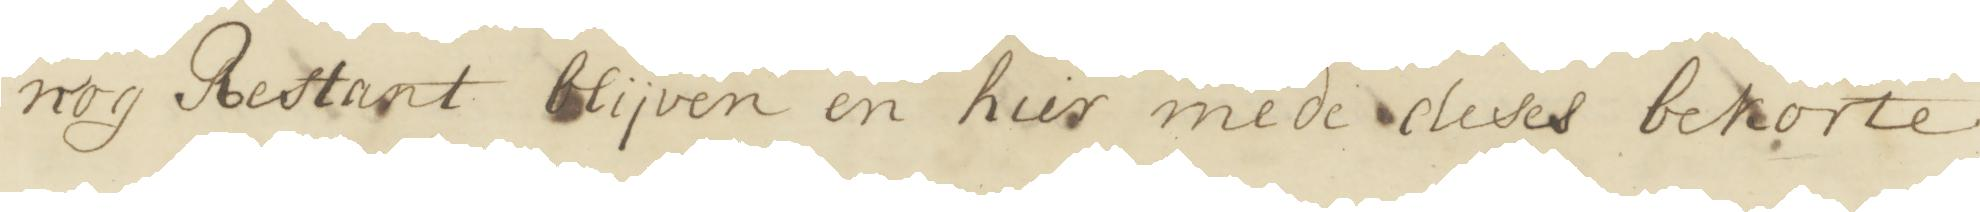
nog Restant blijven en hier mede deses bekorte
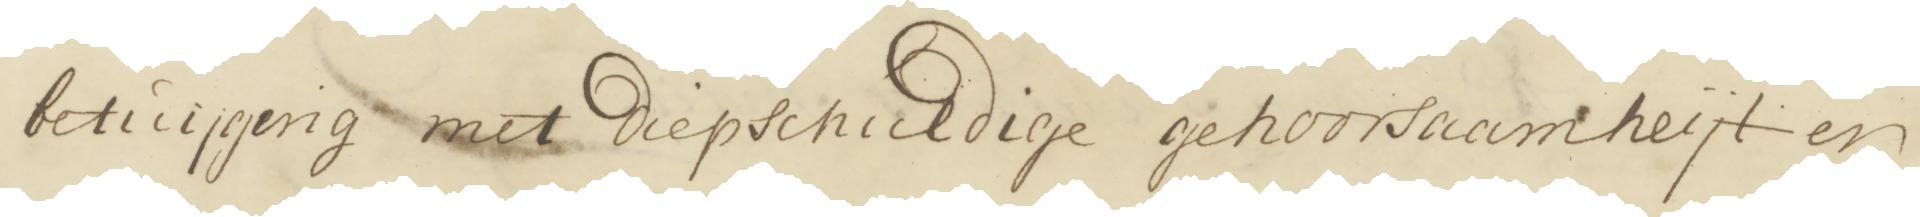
betuijging met diepschuldige gehoorsaamheijt en
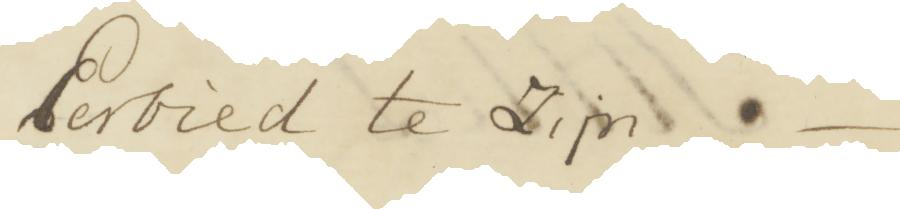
Eerbied te zijn. —
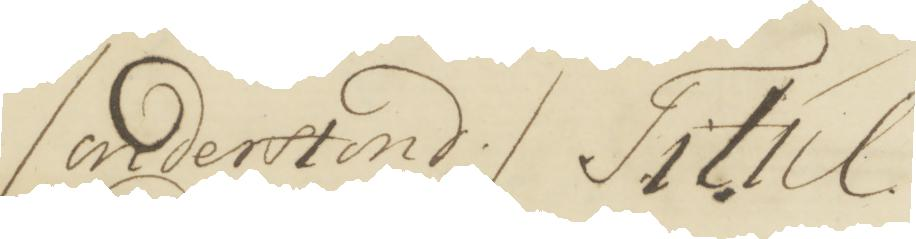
/onderstond:/ Titul
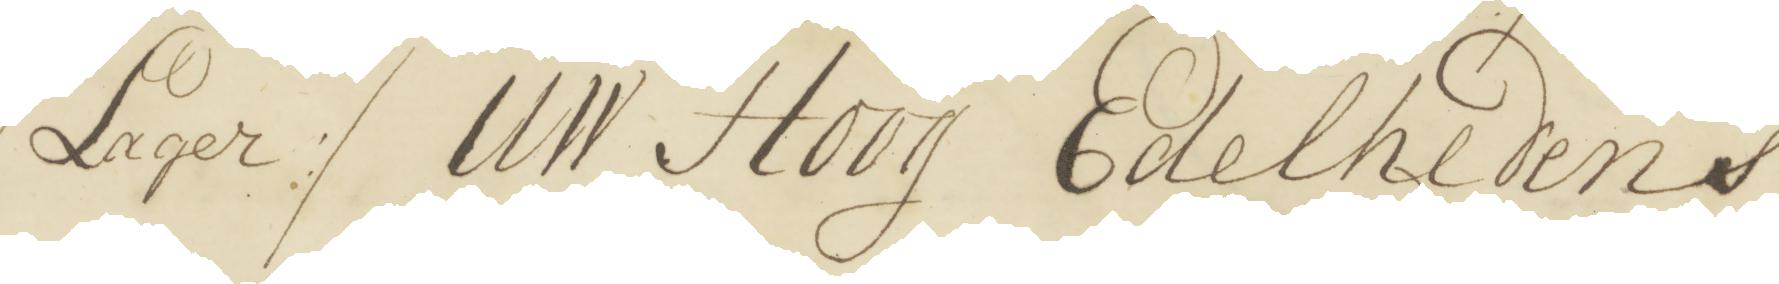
Lager:/ UW Hoog Edelhedens
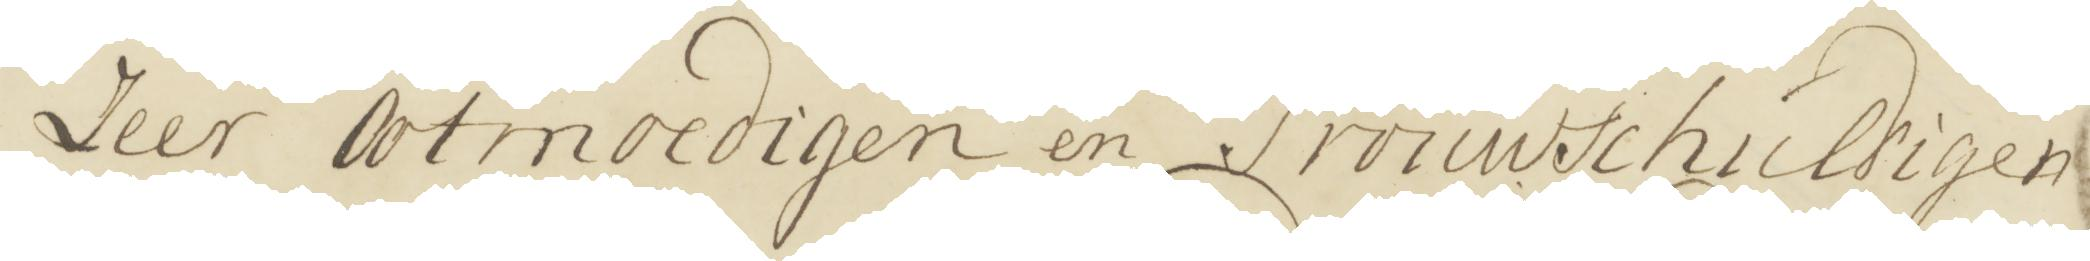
zeer Ootmoedigen en Trouwschuldigen
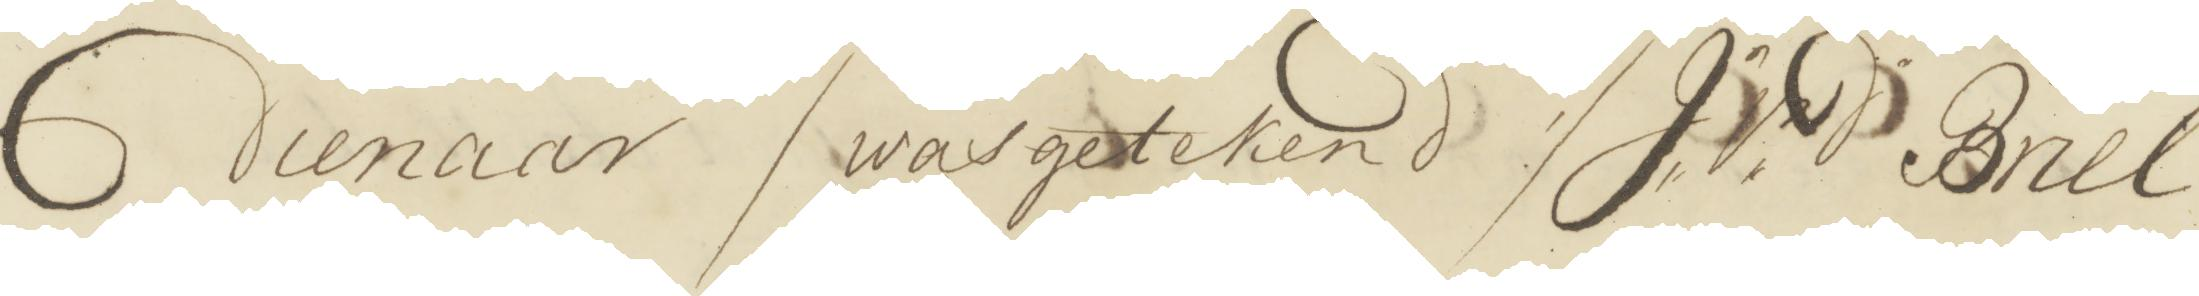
dienaar / was getekend :/ J„n v„ d" Briel
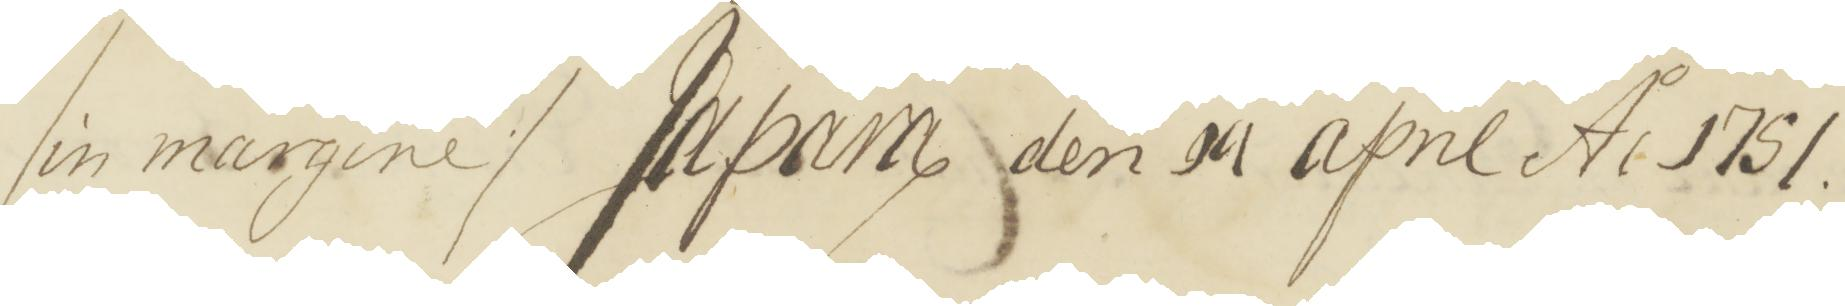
/in margine:/ Japara den 14 april A,o 1751.
